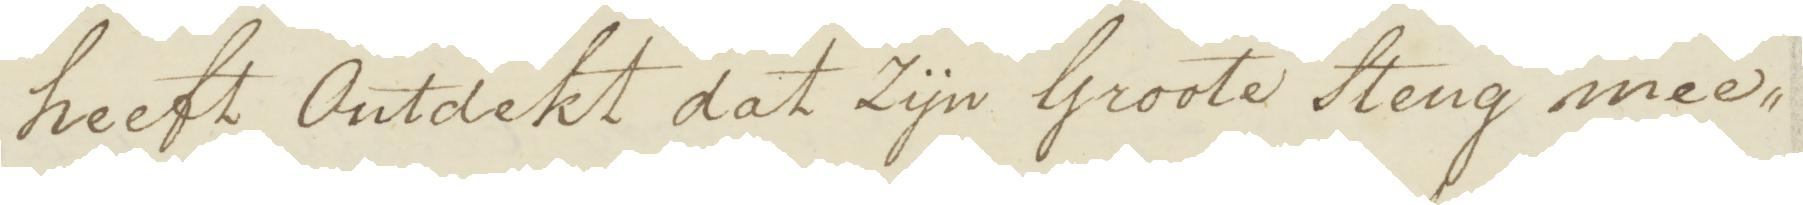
heeft ontdekt dat zijn Groote steng mee„
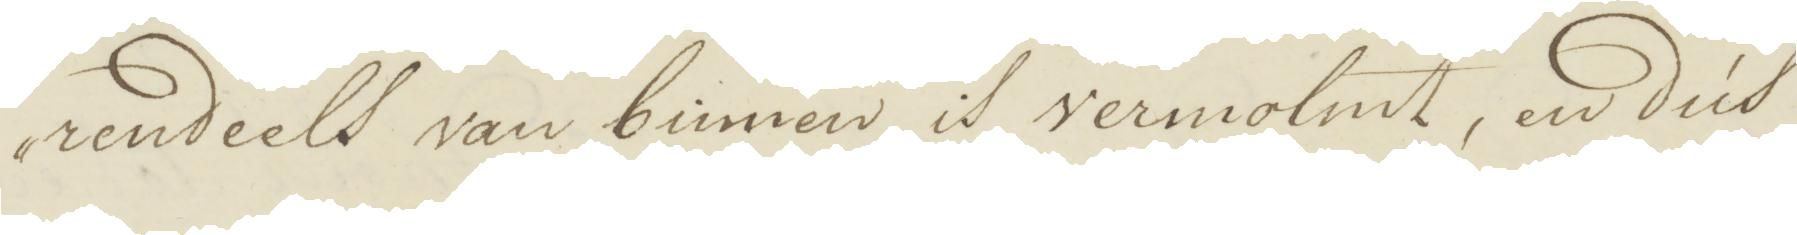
„rendeels van binnen is vermolmt, en dus
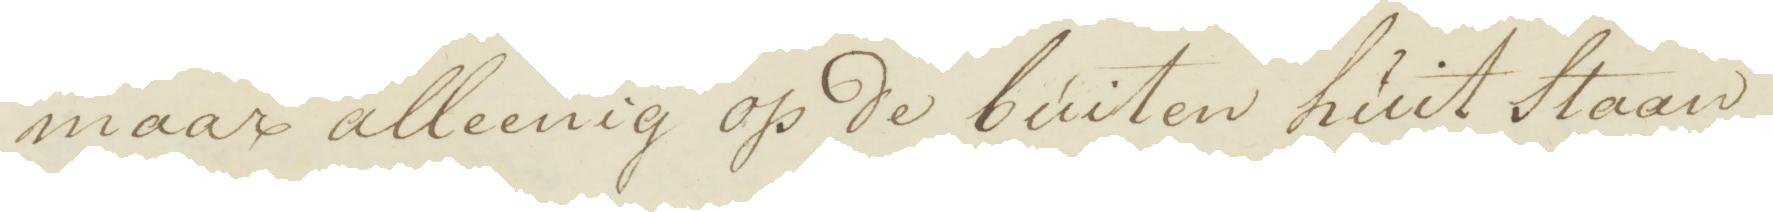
maar alleenig op de buiten huit staan
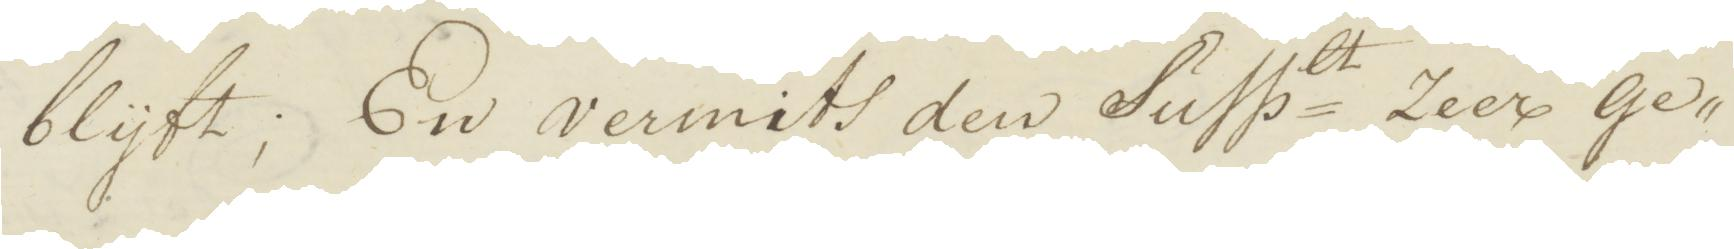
blijft; En vermits den supp=lt zeer ge„
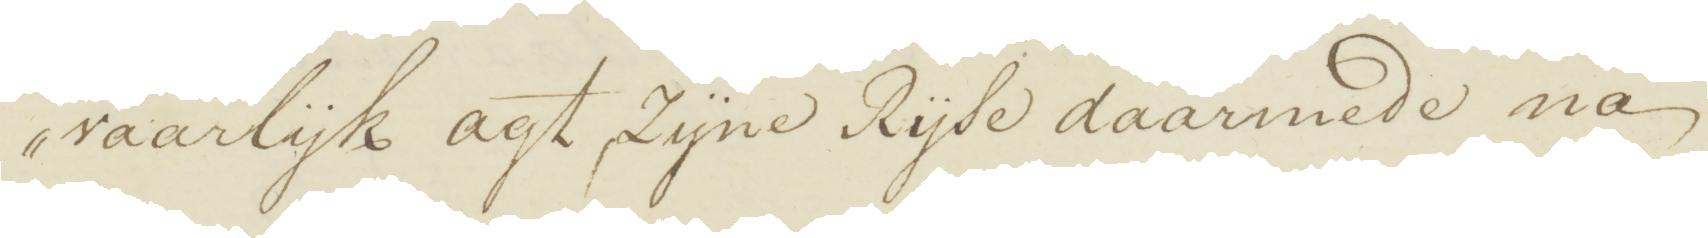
„vaarlijk agt, zijne Rijse daarmede na
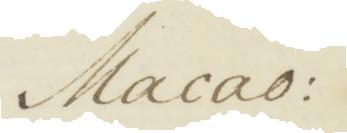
Macao:
